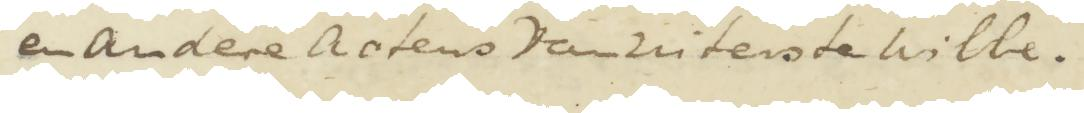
en andere Actens van uiterste Wille.
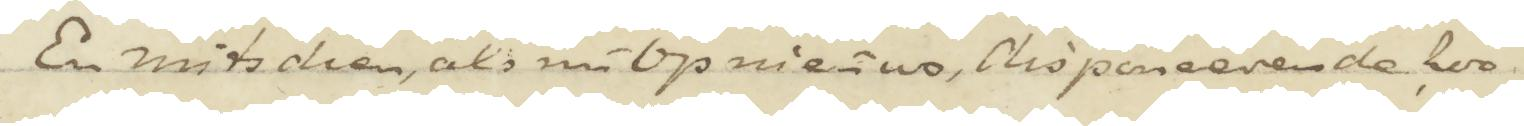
En mitsdien, als nu opnieuw, disponeerende zoo
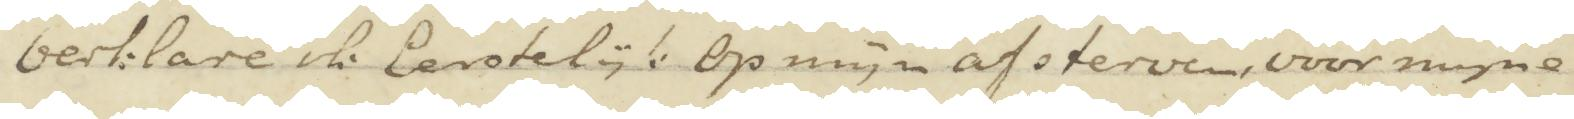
verklare ik Eerstelijk op mijn afsterven, voor myne
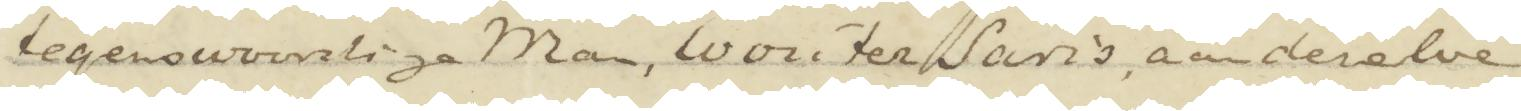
tegenswoordige Man, Wouter Saris aan dezelve
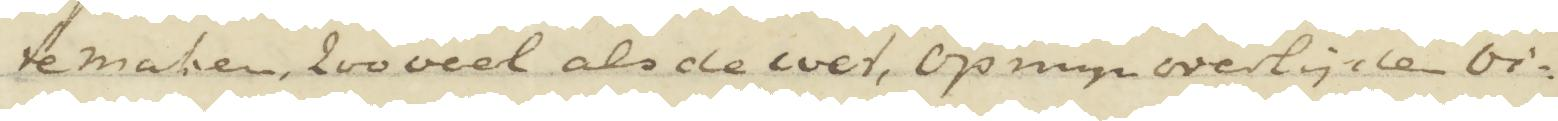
te maken zoo veel als de wet, Op myn overlijden vi=
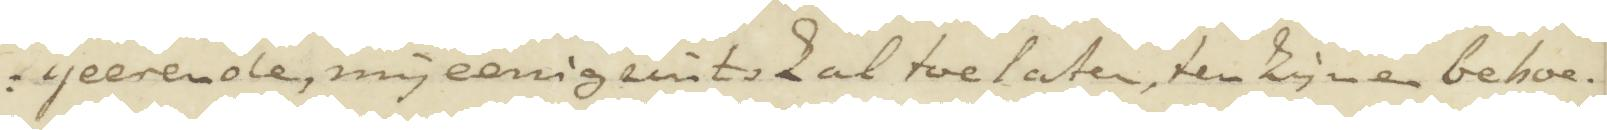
=geerende, mij eenig nut zal toelaten, ten zijne behoe=
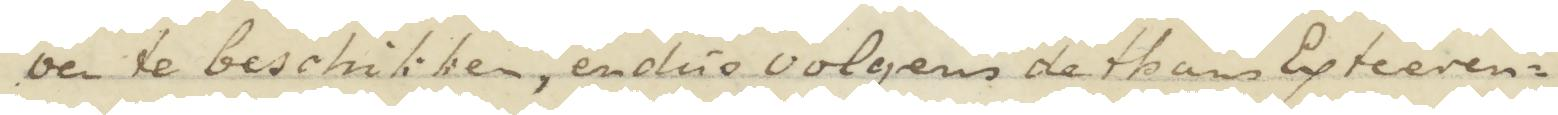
ven te beschikken, en die volgens de thans Exteeren=
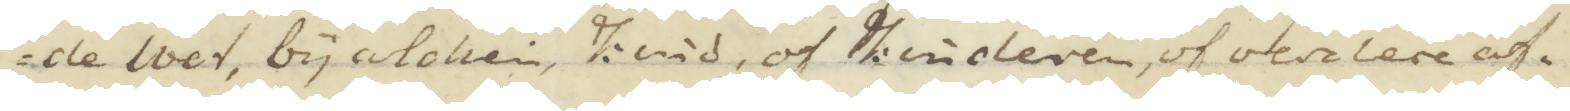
=de wet, bij aldien, kind,of kinderen, of verdere af„
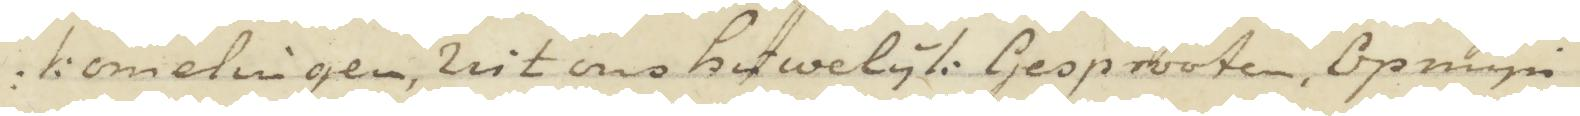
=komelingen, uit ons huwelijk Gesprooten, Op myn
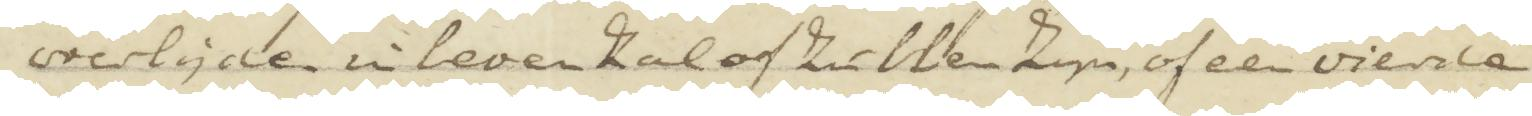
overlijden in leven zal of zullen zyn, of een vierde
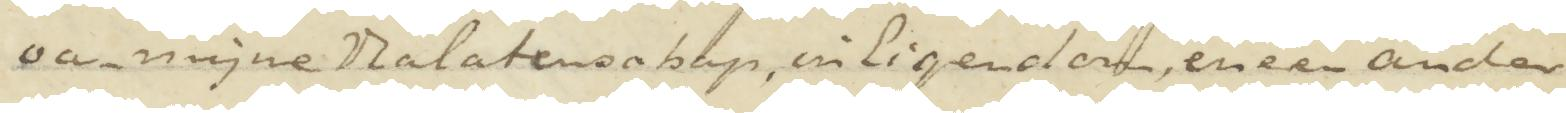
aan mijne Nalatenschap, in Eigendom, en een ander
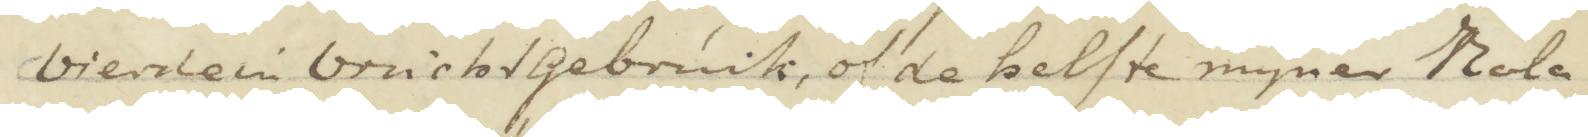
vierden vruchtgebruik, of de helfte myner Nala
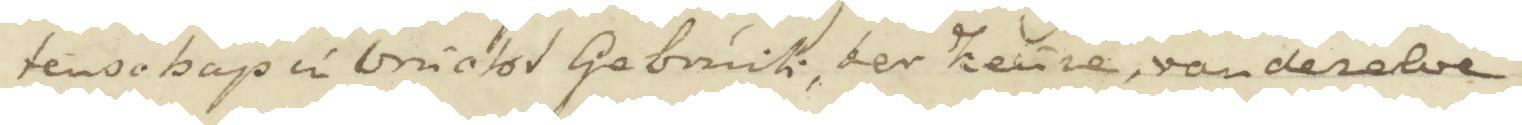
tenschap in vrucht Gebruik, der Keuze, van dezelve
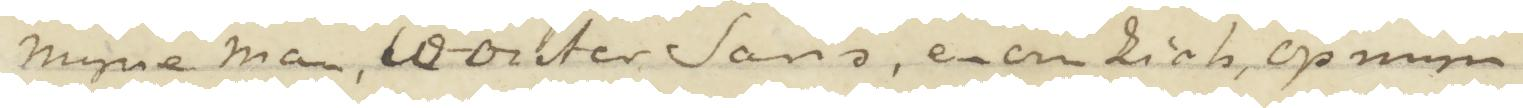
myne man, Wouter Saris, en om zich op myn
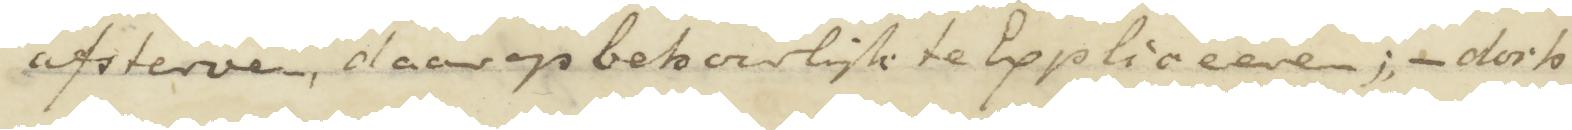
afsterven, daar op behoorlijk te Expliceeren; - doch
